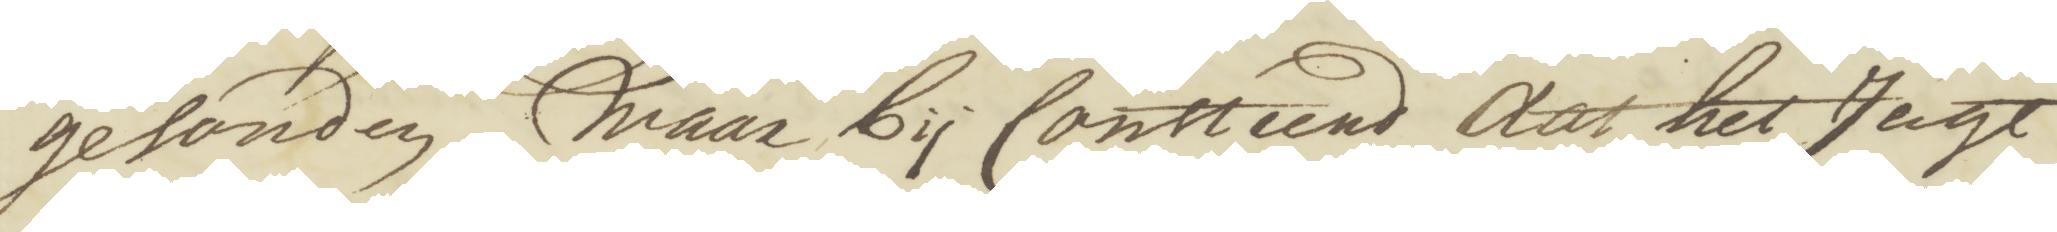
gesonden, waar bij Consteerd dat het Jagt
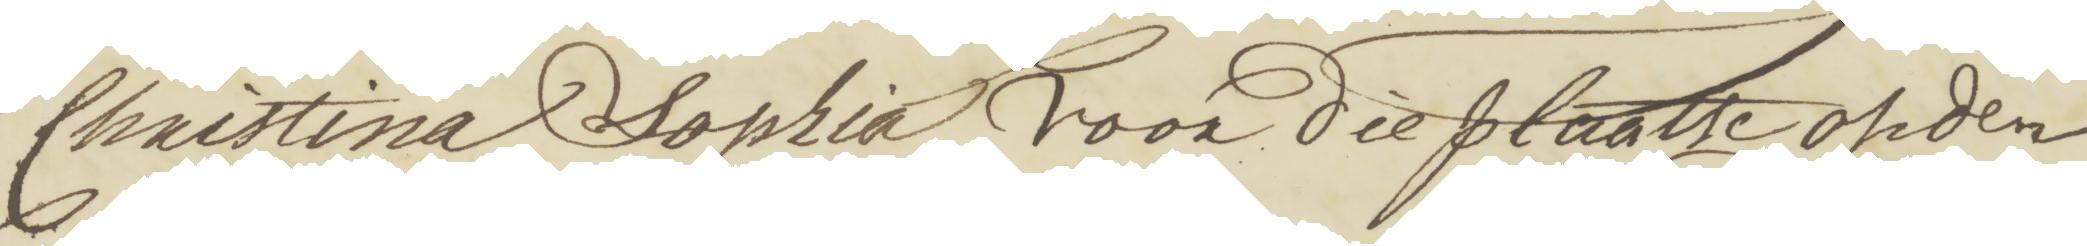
Christina Sophia voor die plaatse op den
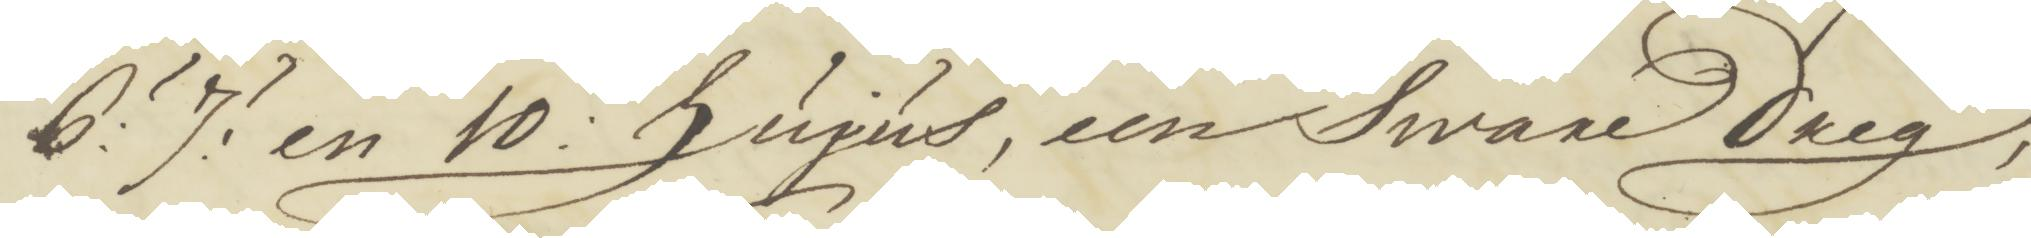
6:' 7:' en 10:' hujus, een sware dreg,
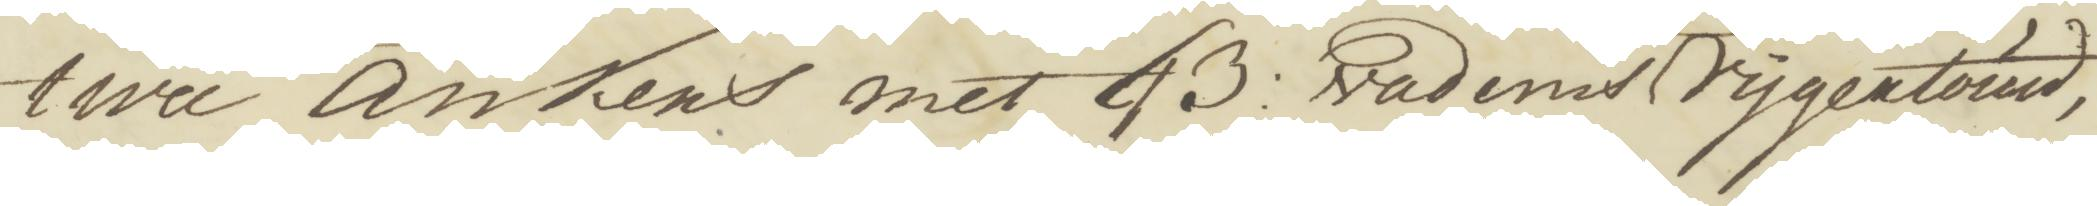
twee Ankers met 43: vadems vijgertouw,
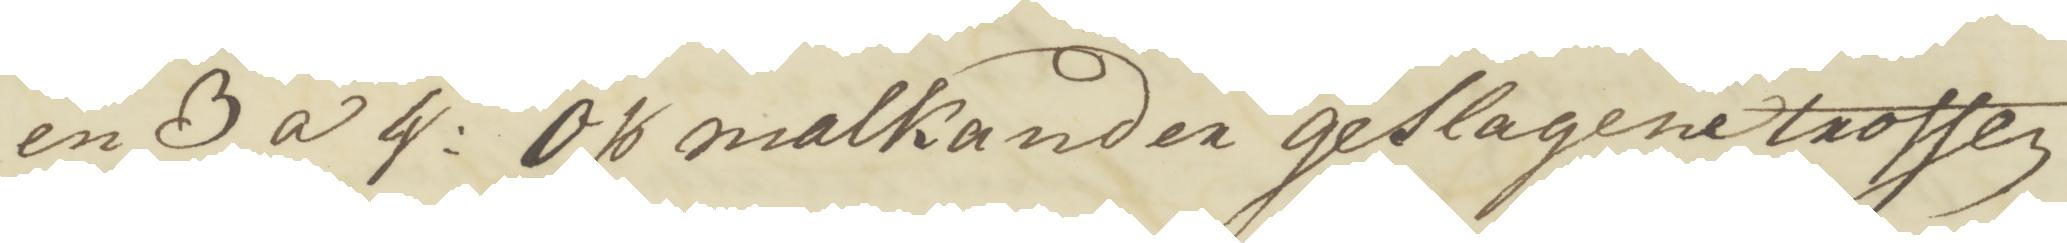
en 3 a 4: op malkander geslagene troffen
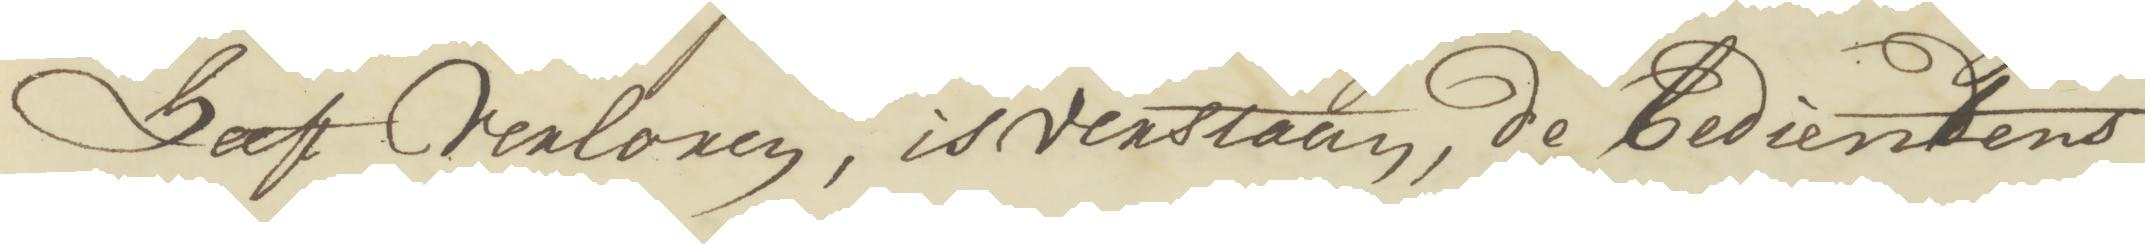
heeft verloren, is verstaan, de bediendens
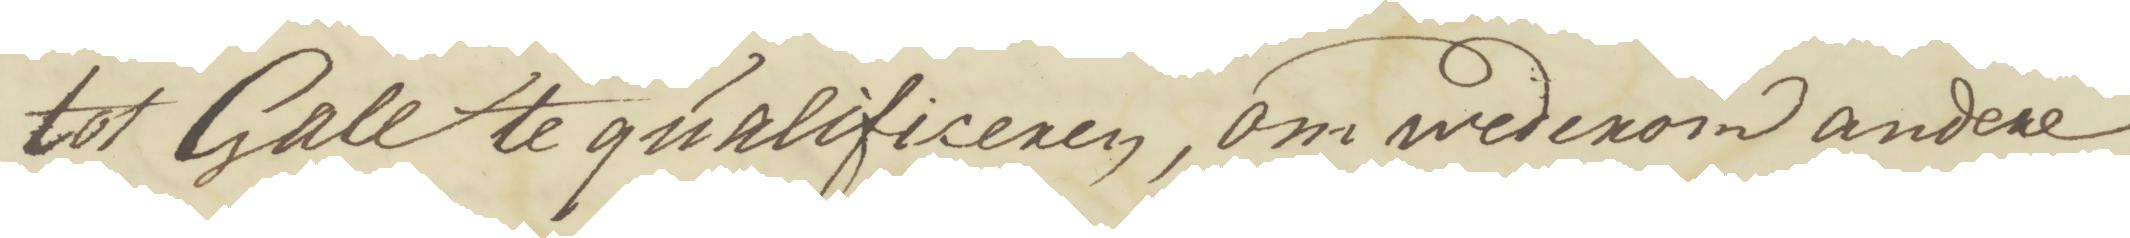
tot Gale te qualificeren, om wederom andere
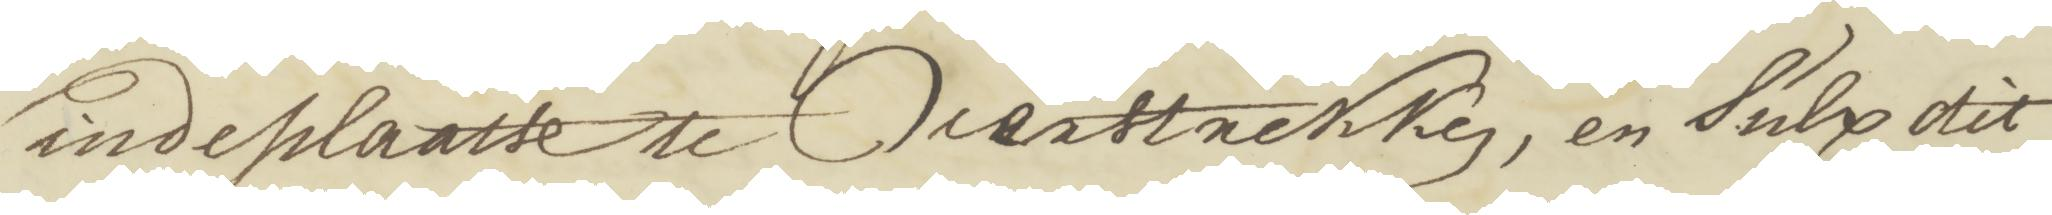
indeplaatse te verstrekken, en sulx dit
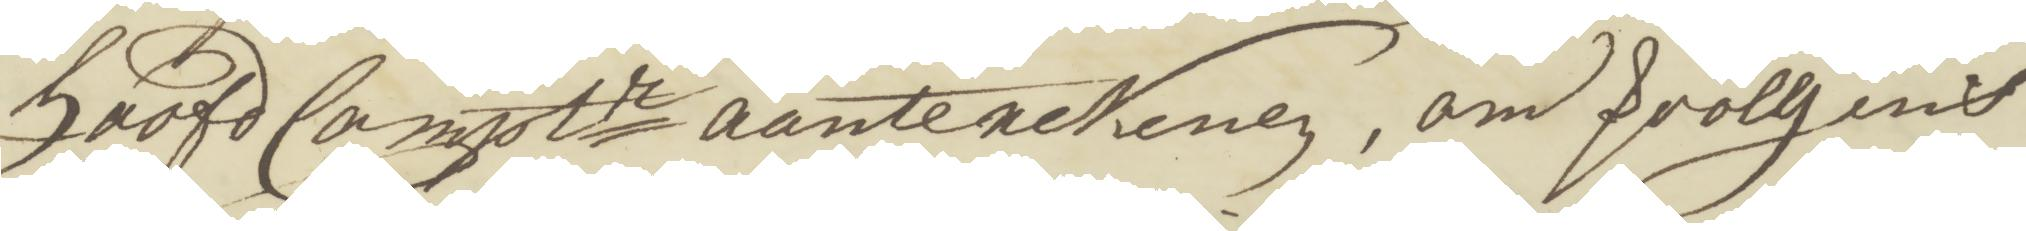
hoofd Compt=r aante rekenen, om vervolgens
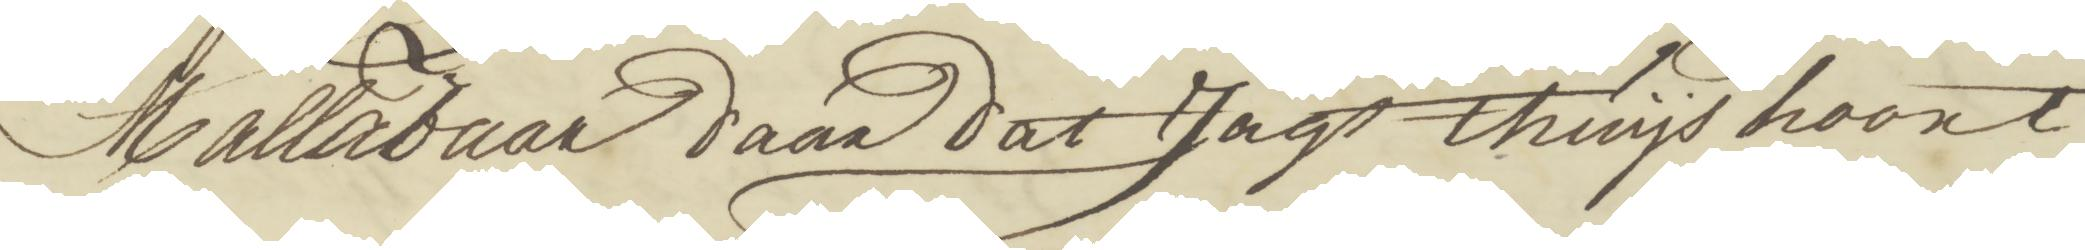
Mallabaar daar dat Jagt thuijs hoort
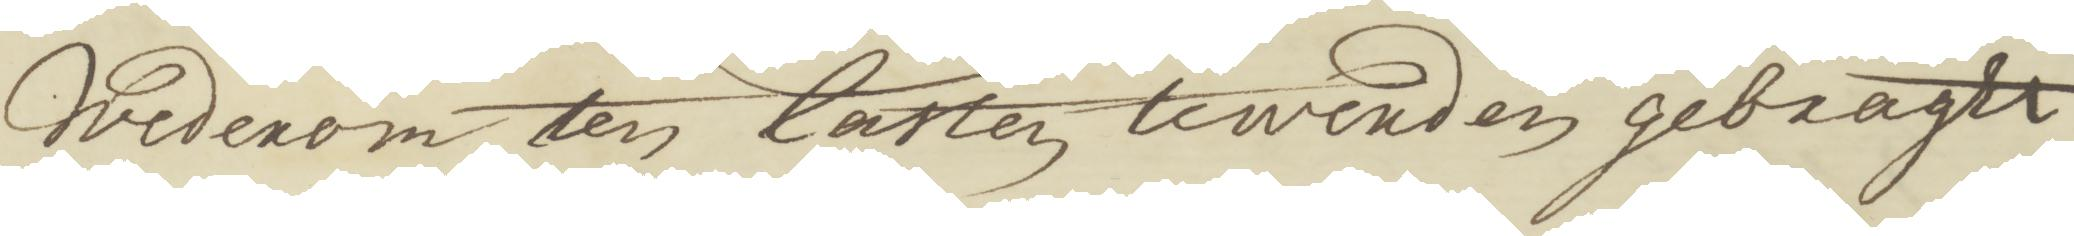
wederom ten lasten te werden gebragt
